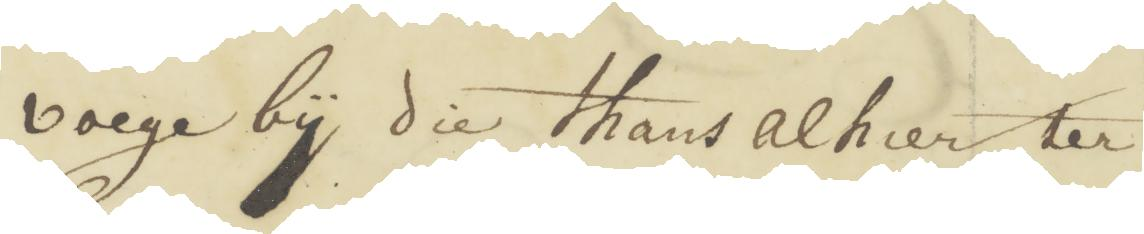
voege bij die thans alhier ter
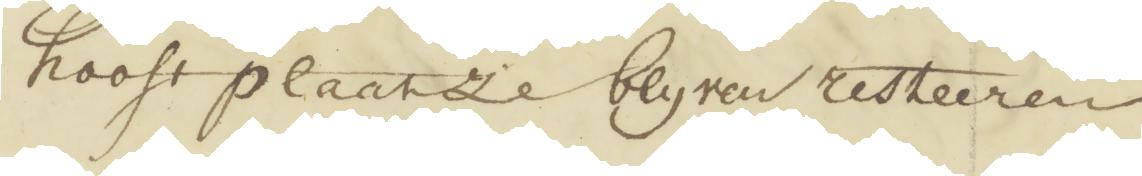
hooft plaatze blyven resteeren
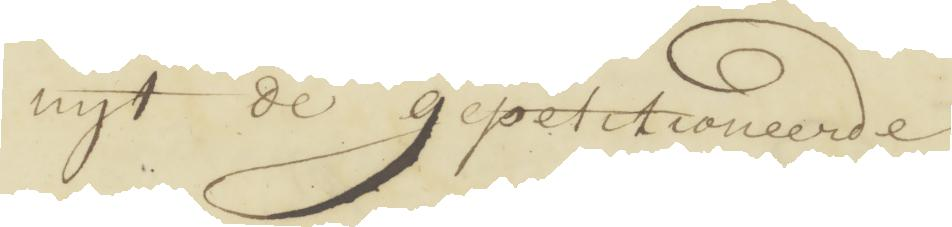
uyt de gepetitioneerde
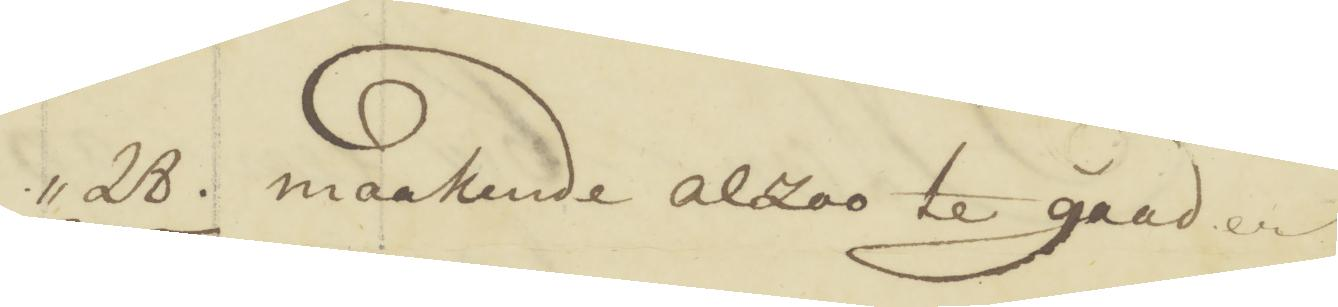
„ 28. maakende alzoo te gaader
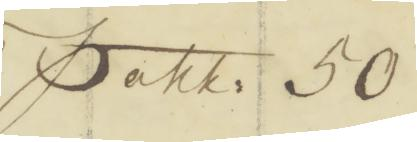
Pakk: 50
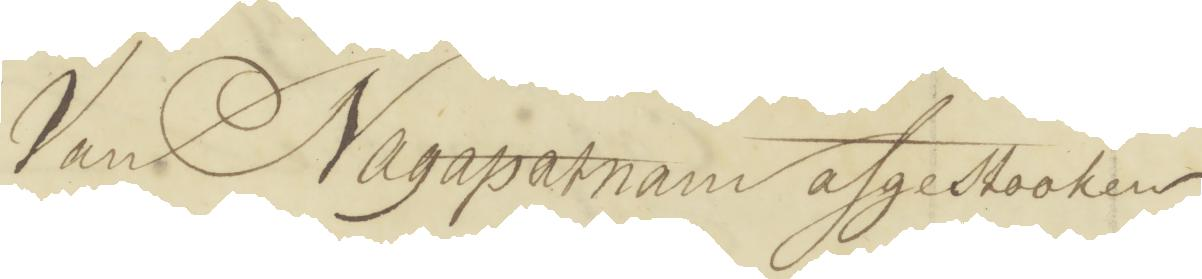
Van Nagapatnam afgestooken
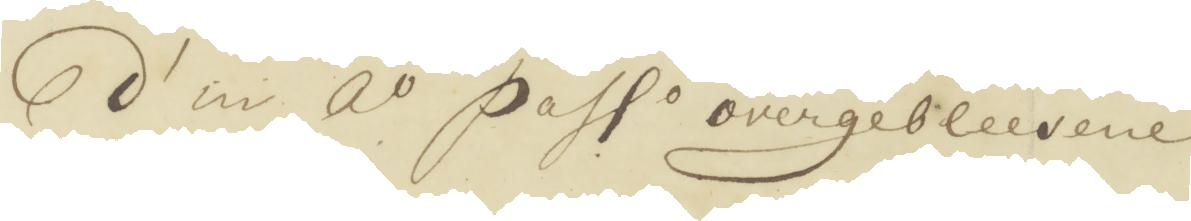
d'in ao passo overgebleevene
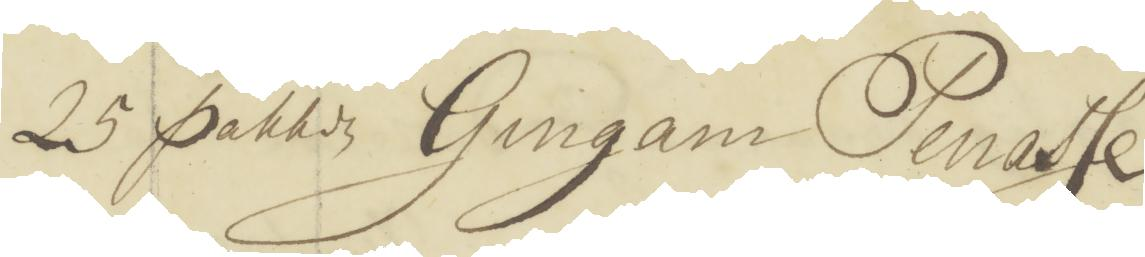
25 pakken Gingam Penasse
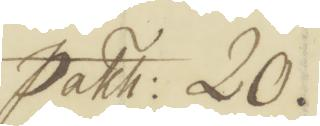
pakk: 20.
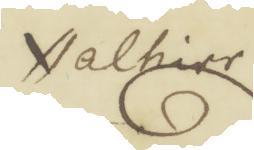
#alhier
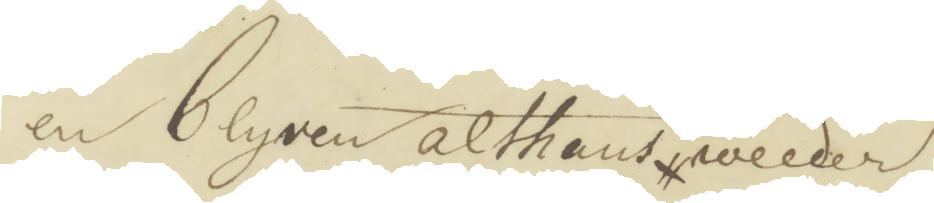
en blyven althans #weeder
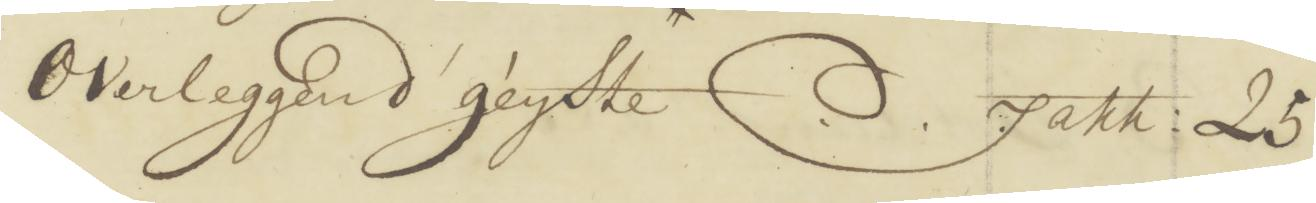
Overleggen d' g'eyste . . .pakk: 25
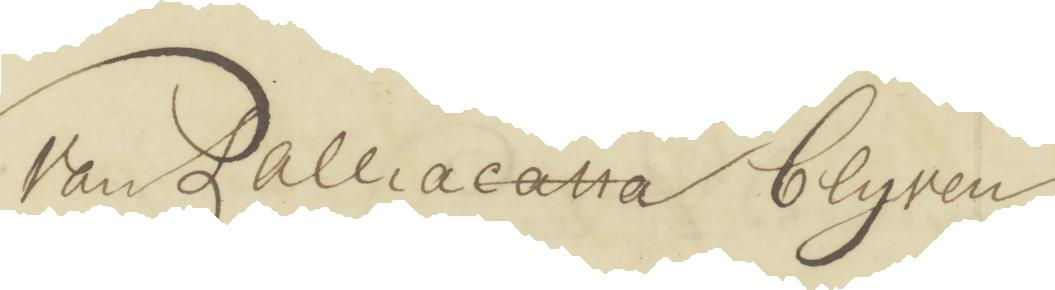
van Palliacatta blyven
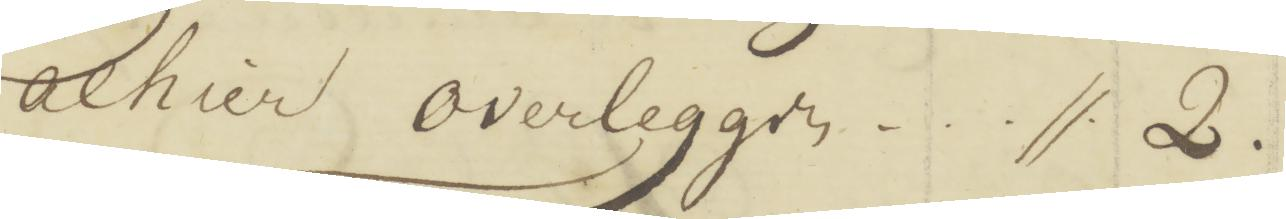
alhier overleggen . . . „. 2.
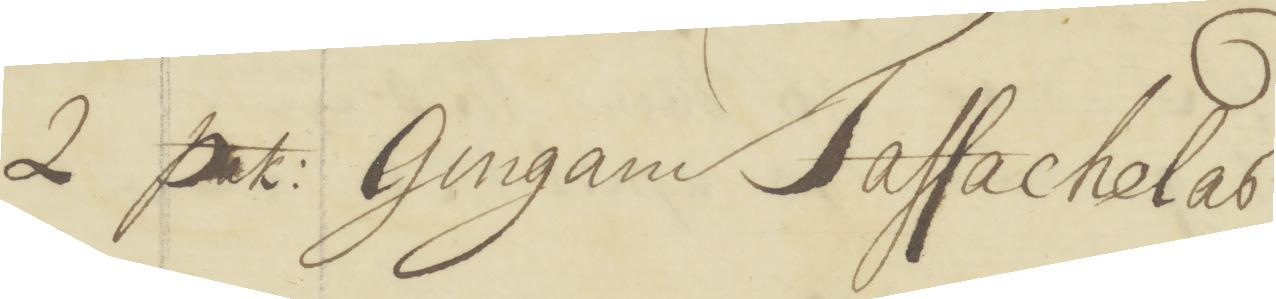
2 pak: Gingam Taffachelas
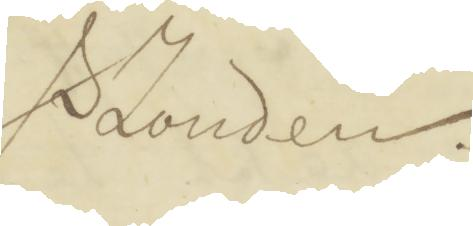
verzonden
